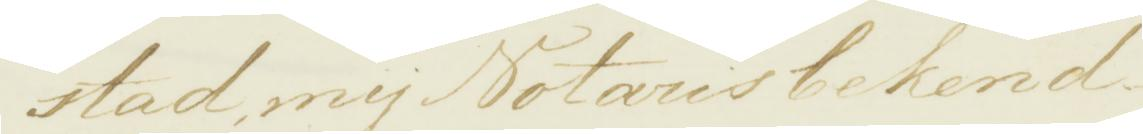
stad, mij Notaris bekend.
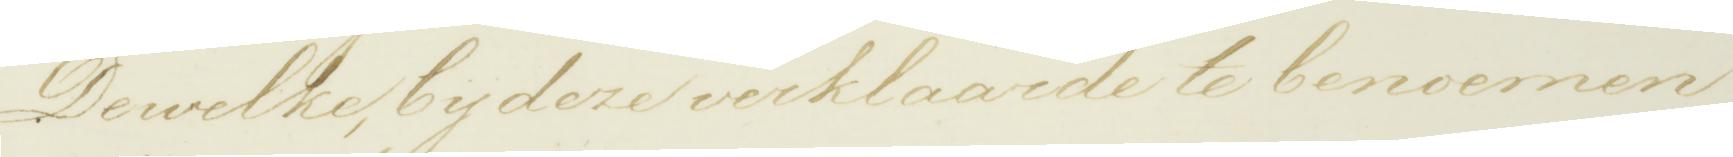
Dewelke, bij deze verklaarde te benoemen
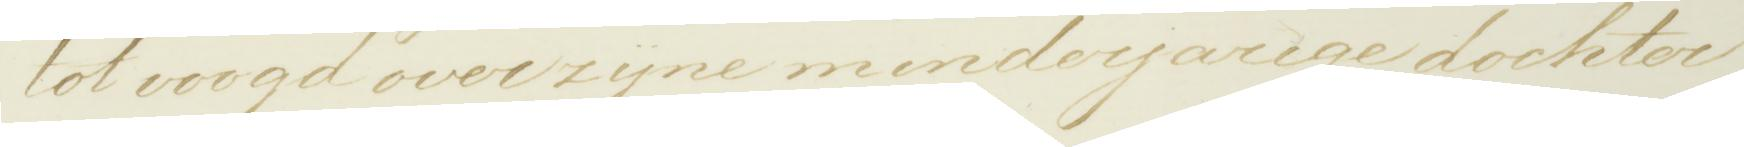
tot voogd over zijne minderjarige dochter
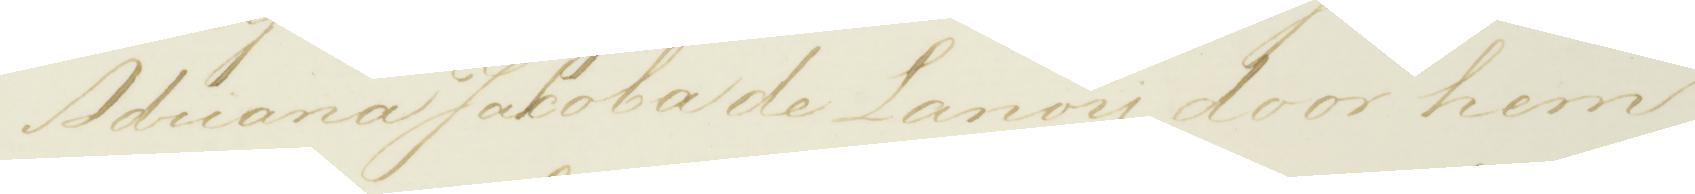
Adriana Jakoba de Lanoij door hem
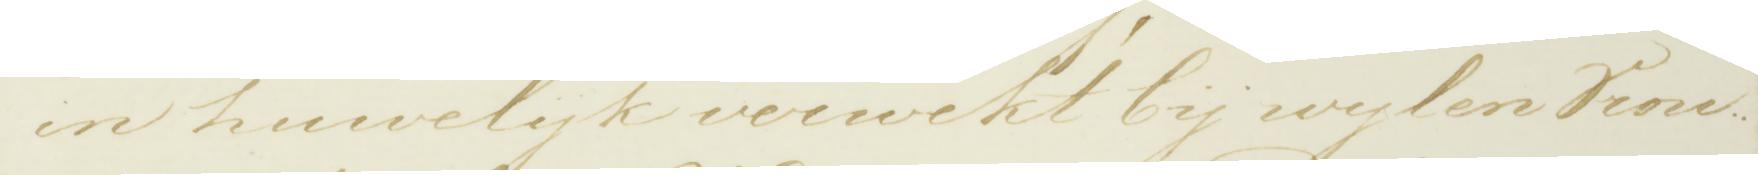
in huwelijk verwekt bij wylen Vrou„
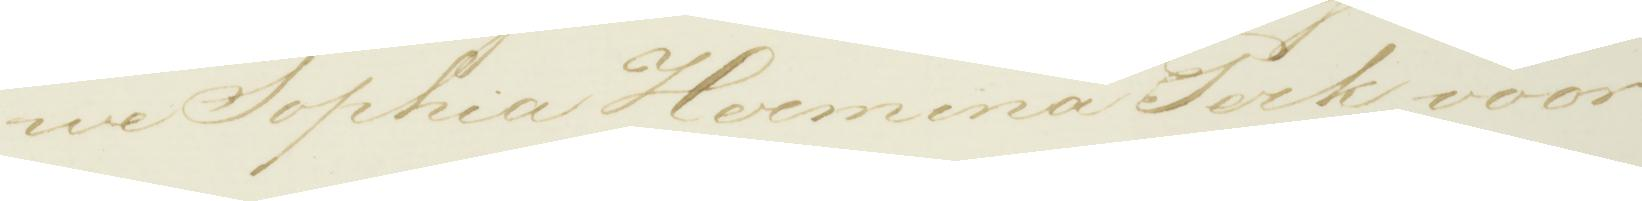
we Sophia Hermina Perk voor
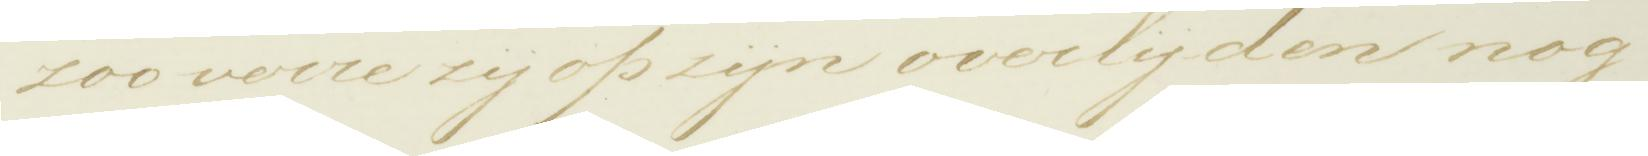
zoo verre zij op zijn overlijden nog
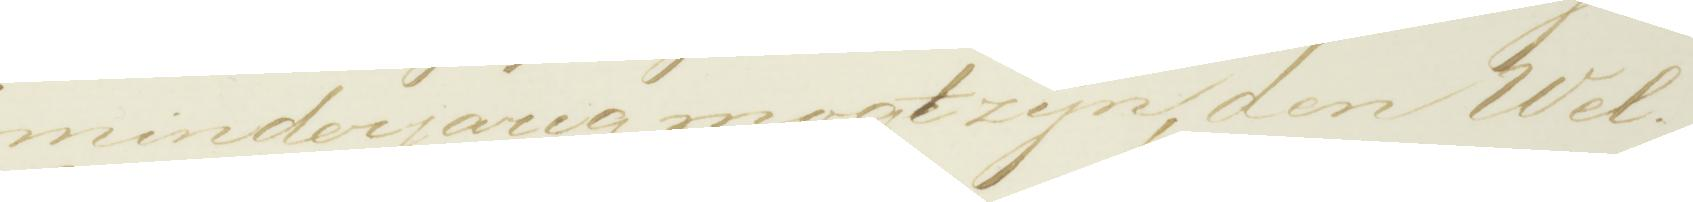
minderjarig mogt zijn, den Wel.
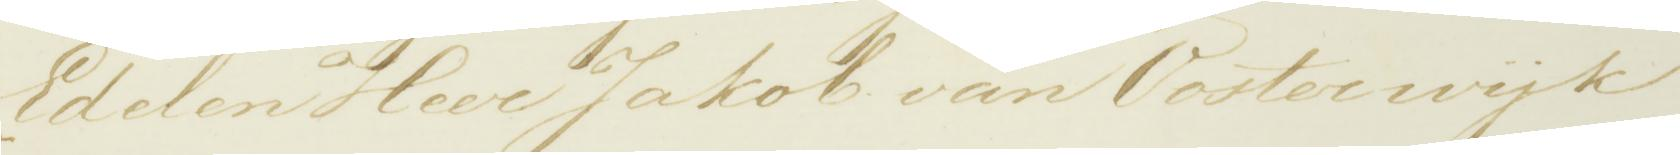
Edelen Heer Jakob van Oosterwijk
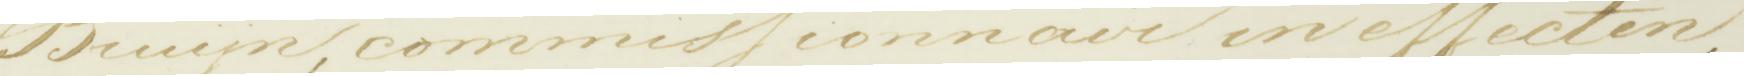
Bruijn, commissionnair in effecten,
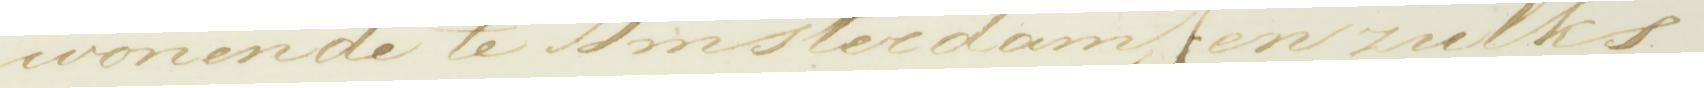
wonende te Amsterdam, ¶ en zulks
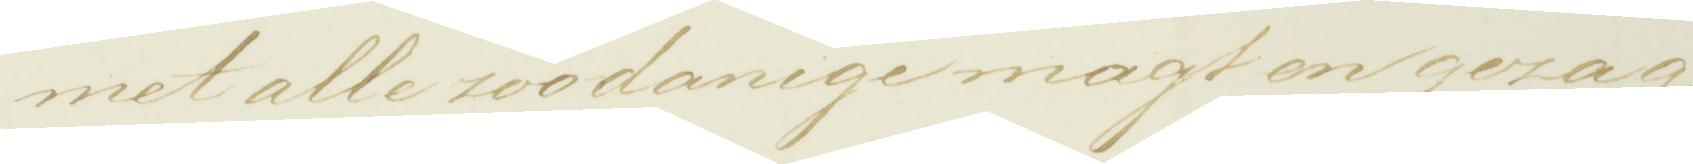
met alle zoodanige magt en gezag
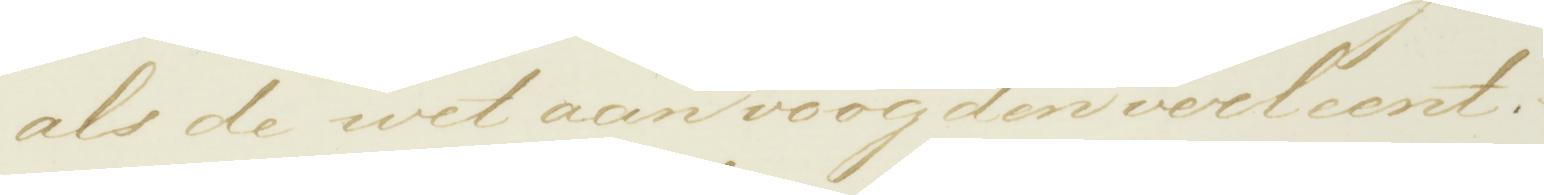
als de wet aan voogden verleent.
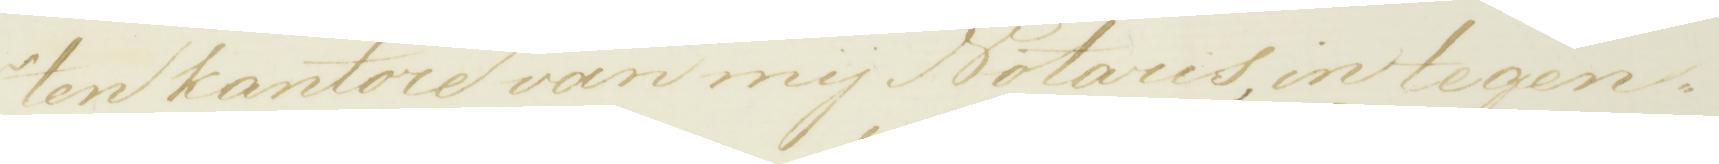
ten kantore van mij Notaris, in tegen„
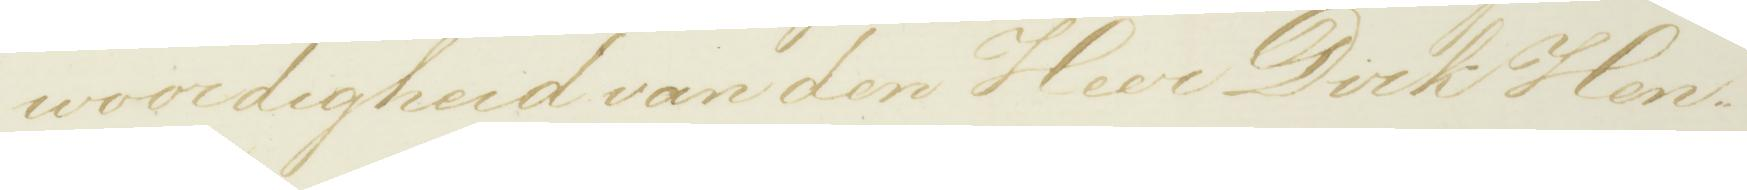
woordigheid van den Heer Dirk Hen„
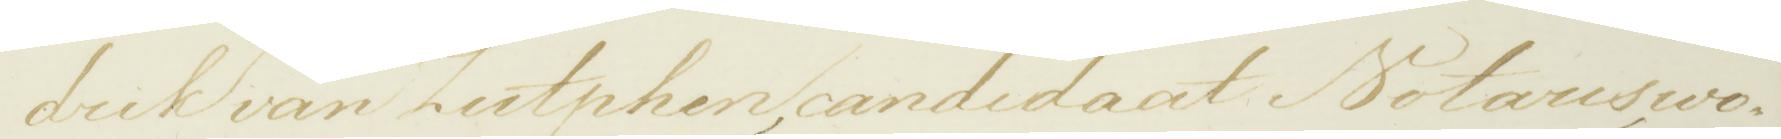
drik van Zutphen, candidaat Notaris wo„
